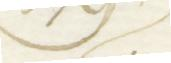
179.—
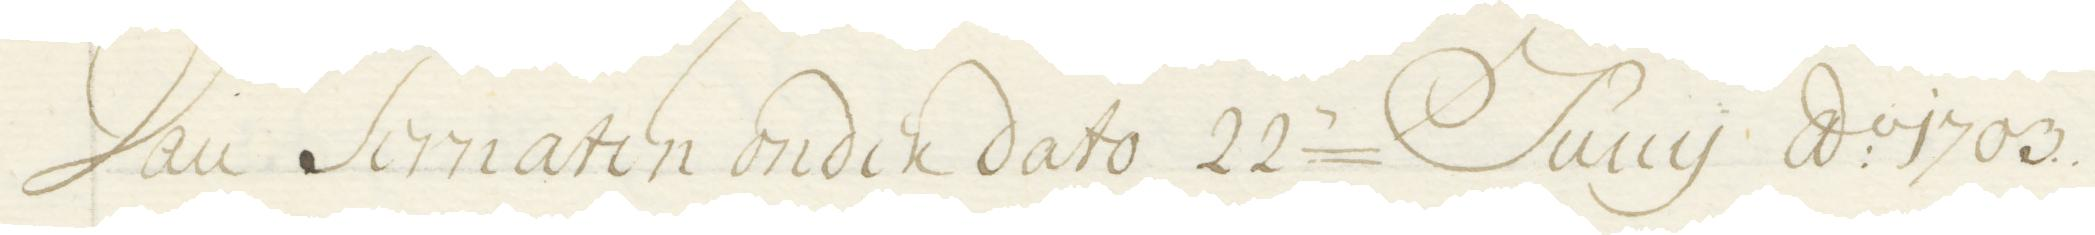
Van Ternaten onder dato 22=' Iunij a:o 1703.
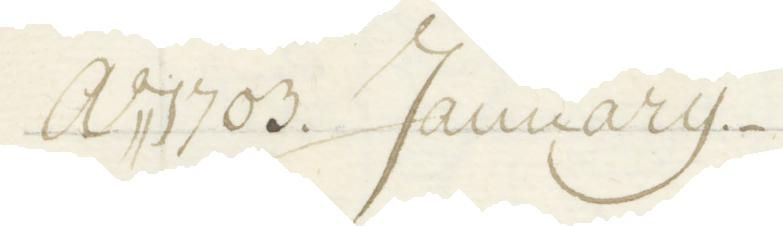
A„o 1703. Januarij.-
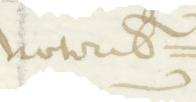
notenb=
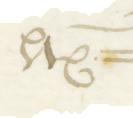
stx=
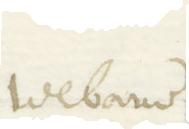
telbare
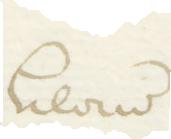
klene
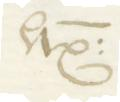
stx:
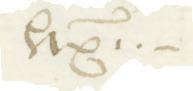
stx:.—
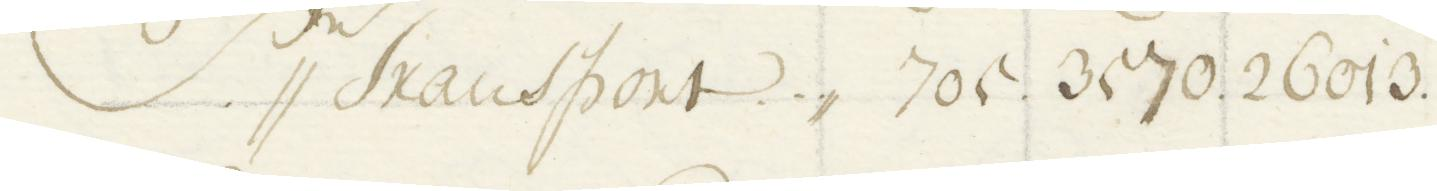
P„r Transport ...„ 705: 3570: 26013.
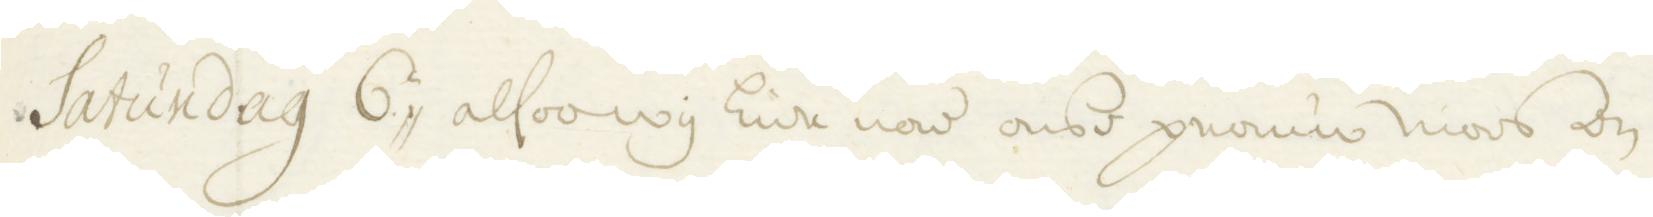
Saturdag 6„e alsoo wij hier nae onse prauw moesten
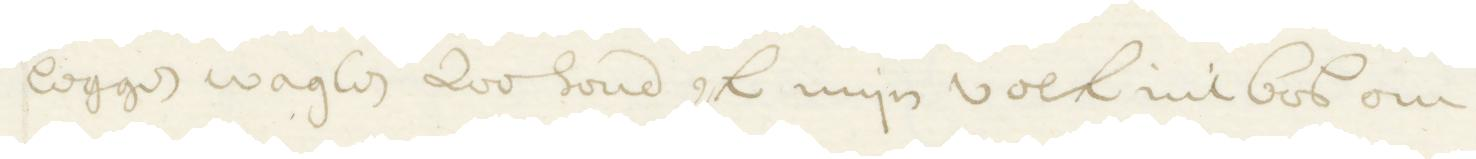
leggen wagten zoo sond jk mijn volk in't bos om
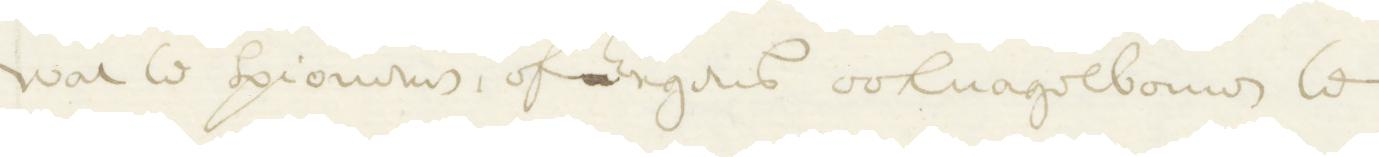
wat te spioneren, of Ergens ook nagelbomen te
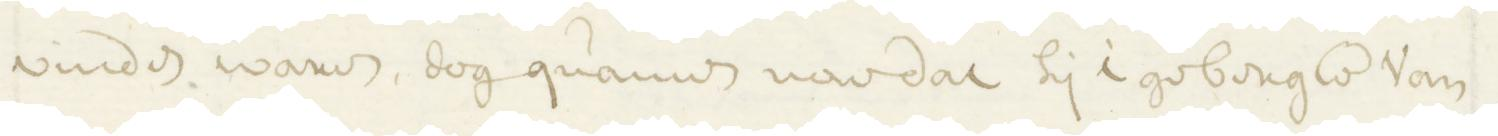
vinden waren, dog quamen nae dat sij 't gebergte van
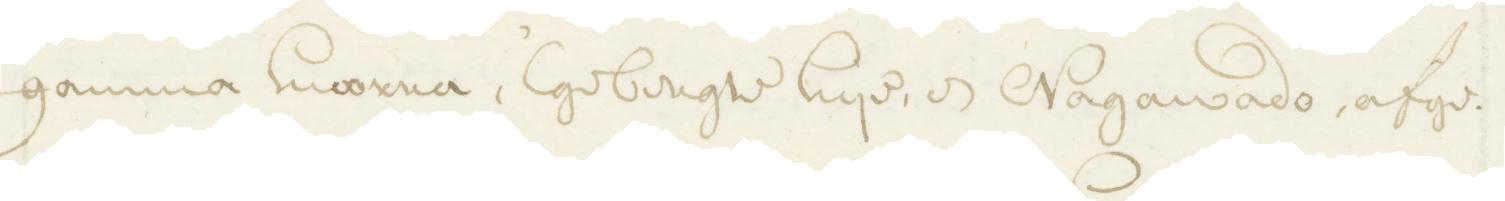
gamma knorra, 'tgebergte kije, en Nagawado, afge.
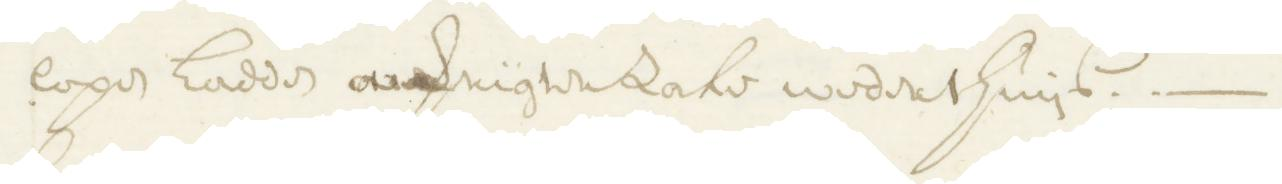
.lopen hadden onverrigterzake weder thuijs. . —
